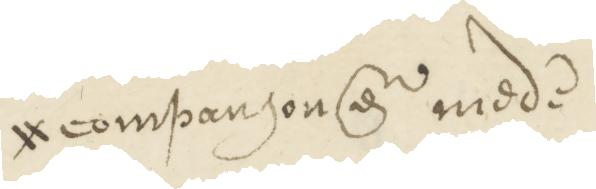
#companjon ende mede
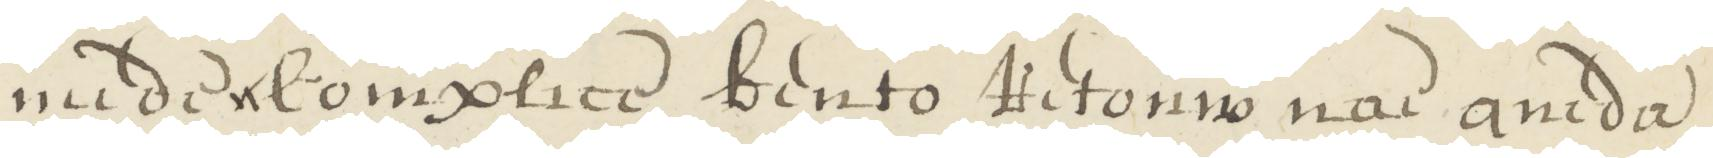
mede #Complice bento Retouro nae queda
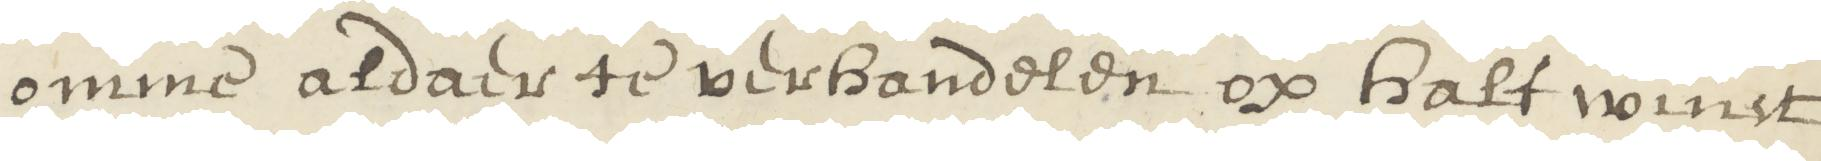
omme aldaer te verhandelen op half winst
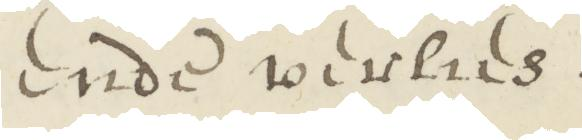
ende verlies
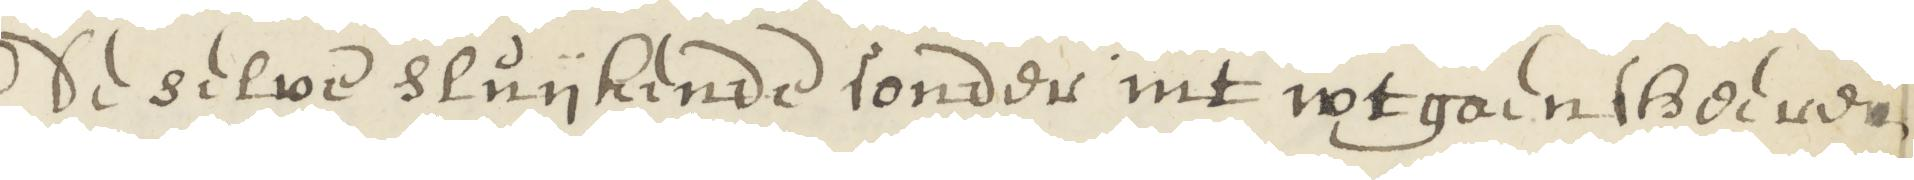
de selve sluijkende sonder int wtgaen sheeren
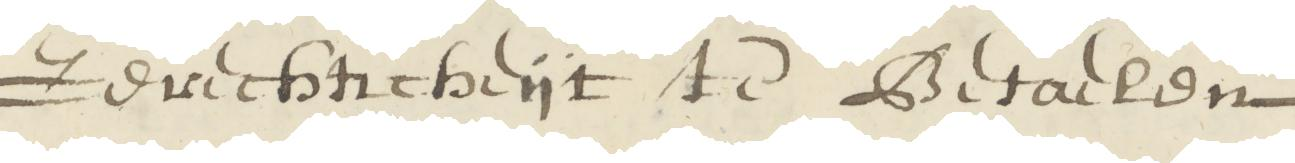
Gerechticheijt te Betaelen
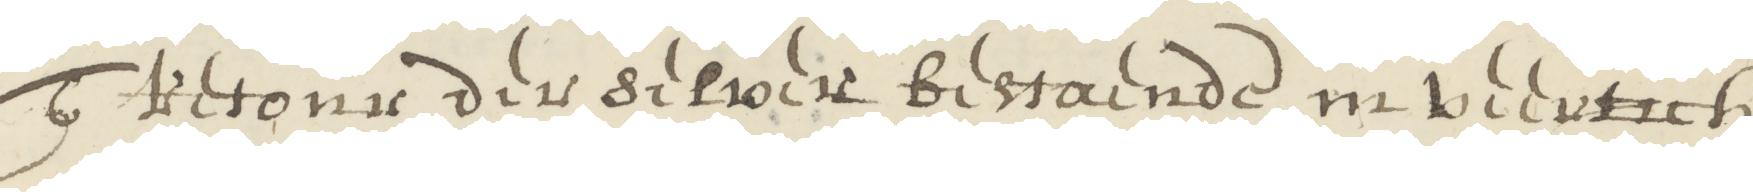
T retour der selver bestaende in veertich
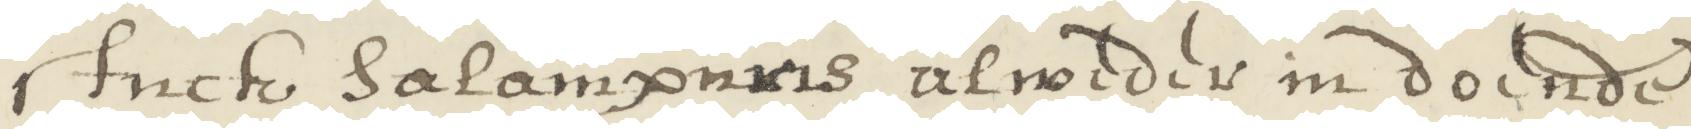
stuck salampuris alweder in doende
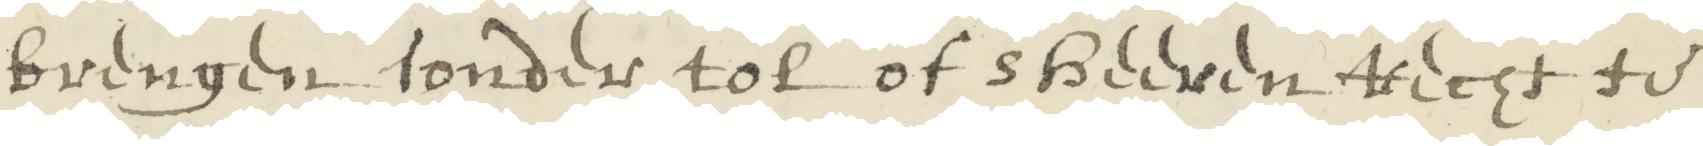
brengen sonder tot of sheeren recht te
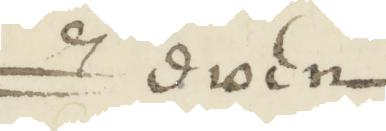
Geven
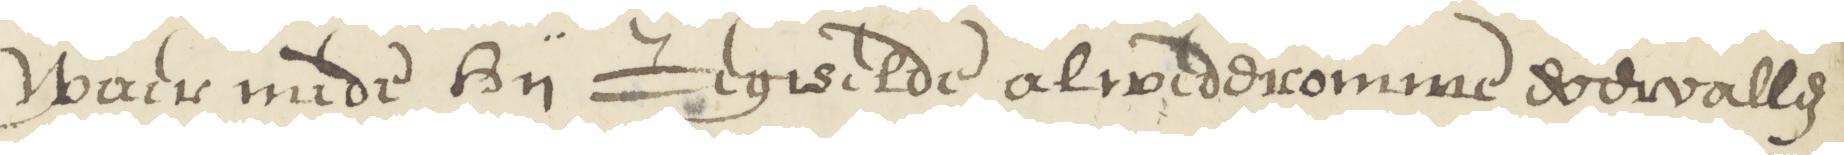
Waer mede hij Gegiselde alwederomme vervallen
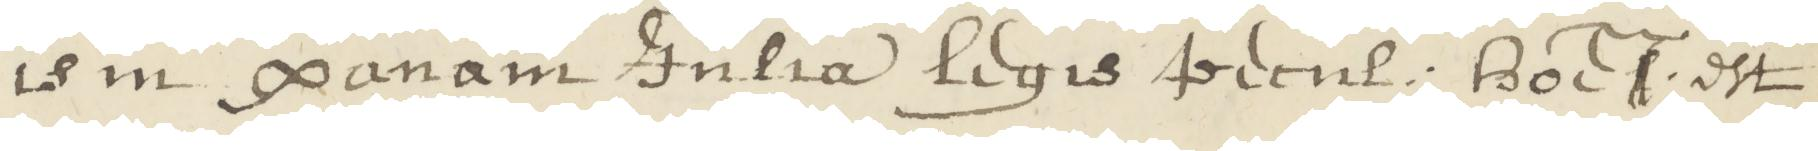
is in panam Inlia legis pecul: Hoef: est
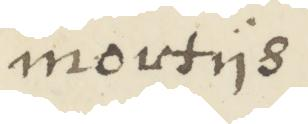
mortijs
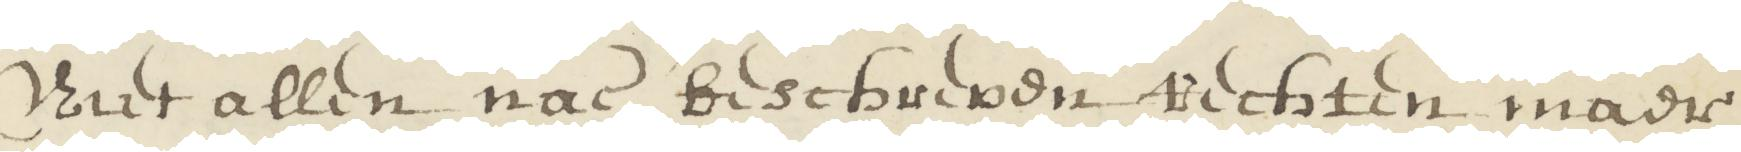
Niet allen nae beschreven rechten maer
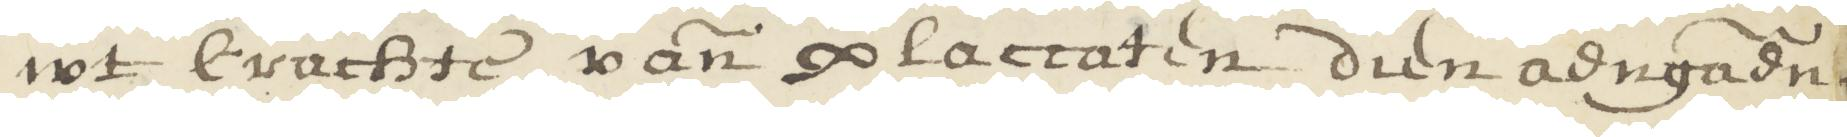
wt Crachte van placcaten dien aengaen
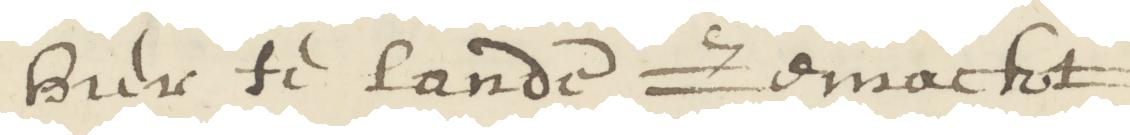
hier te lande Gemackt
